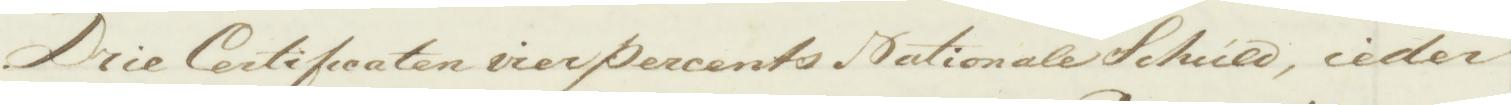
Drie Certificaten vier Percents Nationale Schuld, ieder
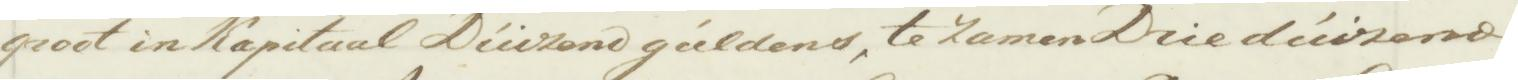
groot in Kapitaal Duizend guldens, te zamen Drie duizend
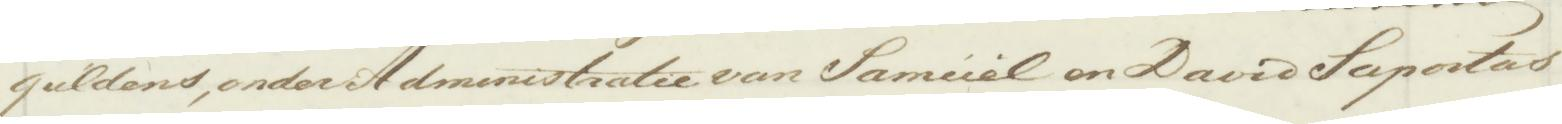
guldens, onder Administratie van Samuel en David Saportas
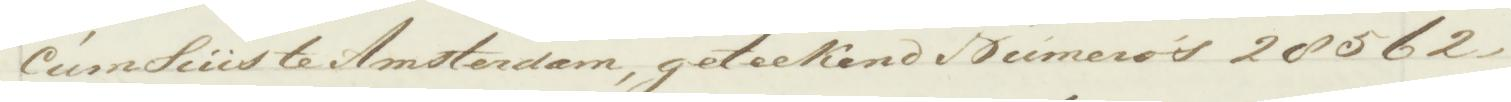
cum suis te Amsterdam, geteekend Numero's 28562,
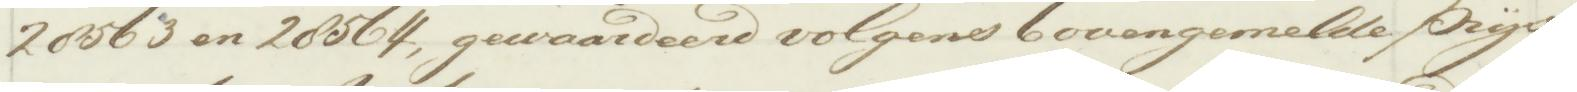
28563 en 28564, gewaardeerd volgens bovengemelde Prijs
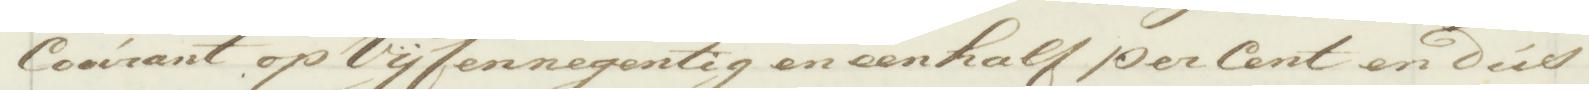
courant op Vijfennegentig en een half per cent en dus
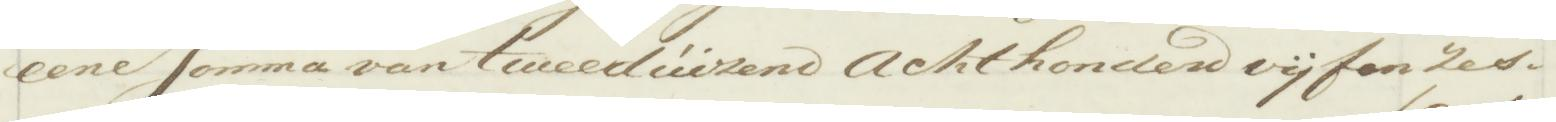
eene somma van twee duizend Achthonderd vijfen zes„
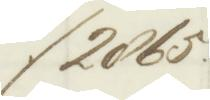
ƒ 2865.
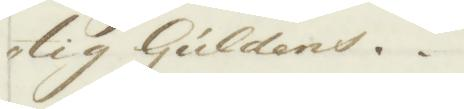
tig Guldens. .
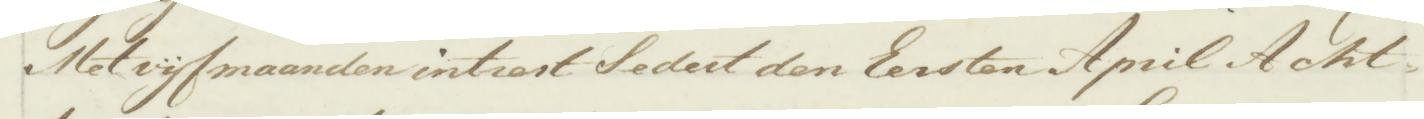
Met vijf maanden intrest sedert den Eersten April Acht„
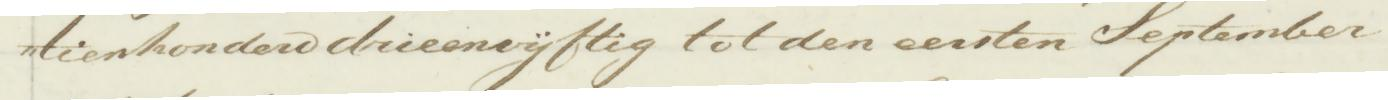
„tienhonderd drieenvijftig tot den eersten September
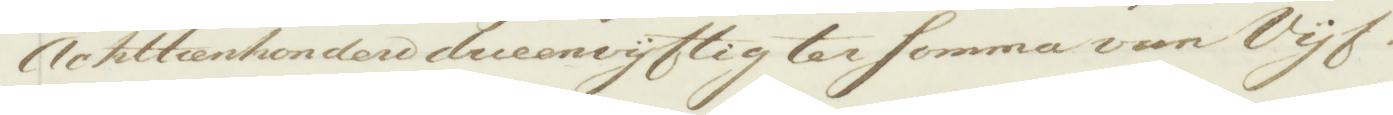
Achttienhonderd drieenvijftig ter somma van Vijf„
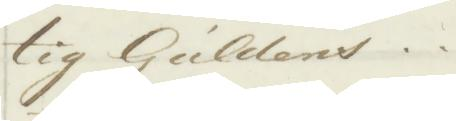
tig Guldens . .
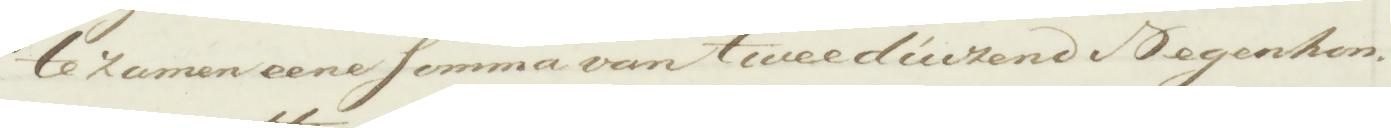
te zamen eene somma van twee duizend Negenhon„
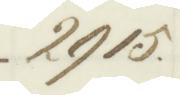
2915.
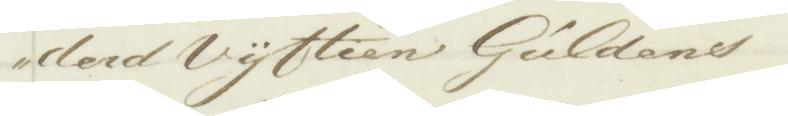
„derd Vijftien Guldens
